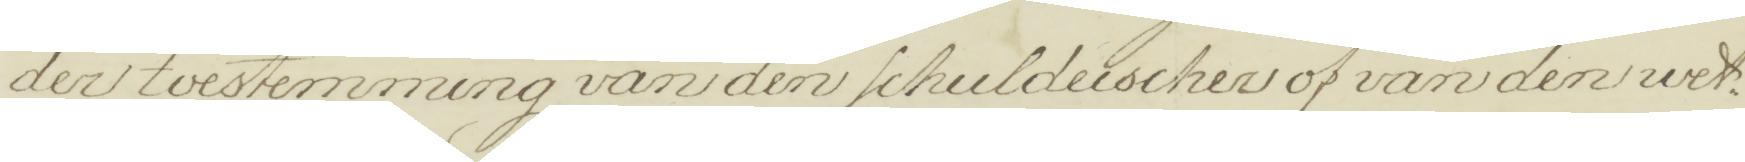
der toestemming van den Schuldeischer of van den wet„
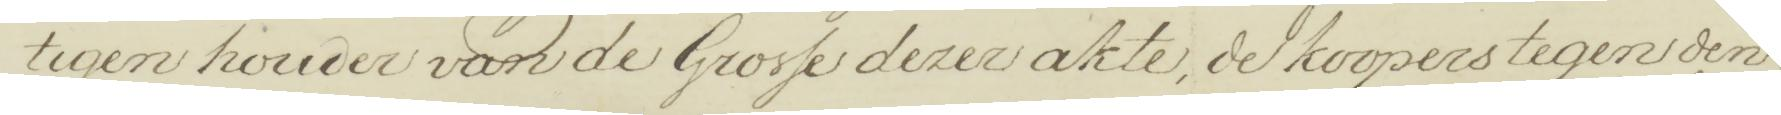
tigen houder van de Grosse dezer akte, de koopers tegen den
